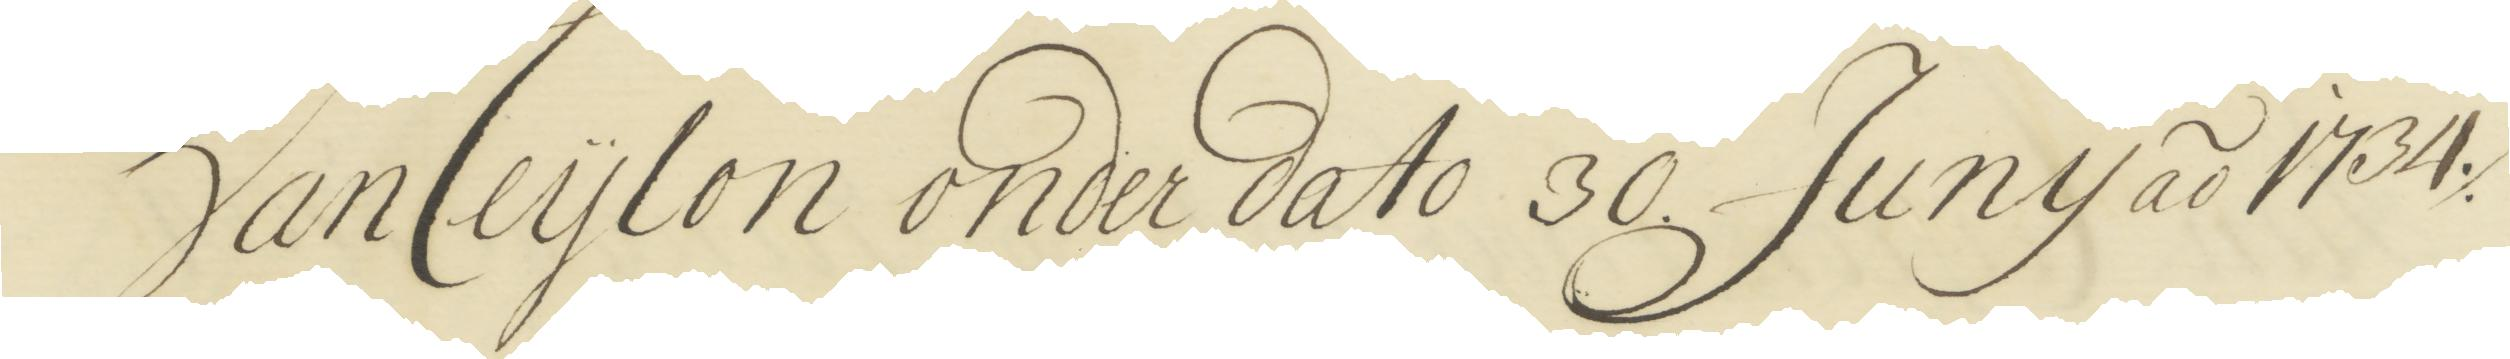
Van Ceijlon onder dato 30. Junij ao 1734./.
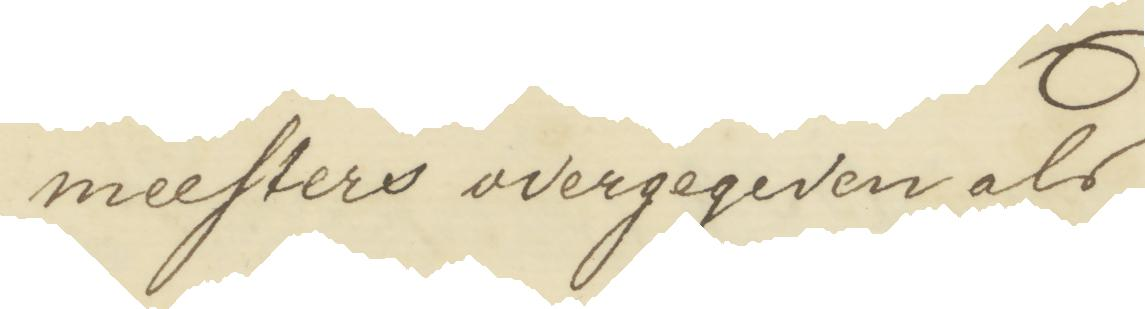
meesters overgegeven als
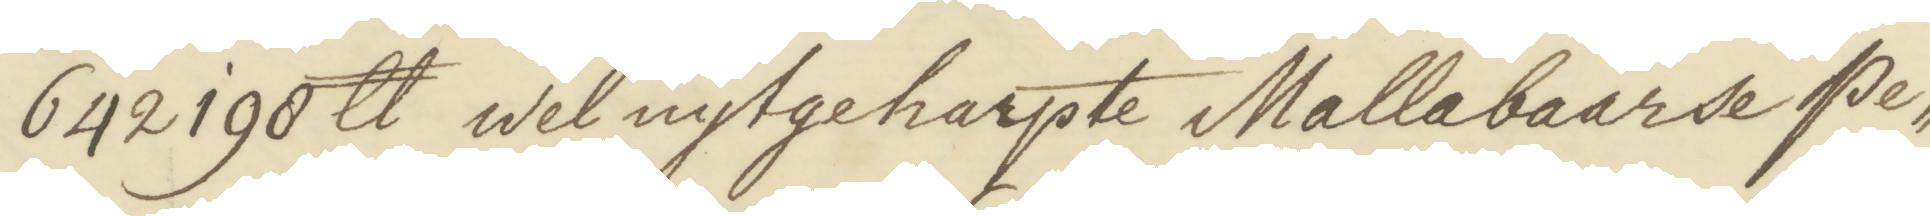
642198 lb wel uytgeharpte Mallabaarse pe
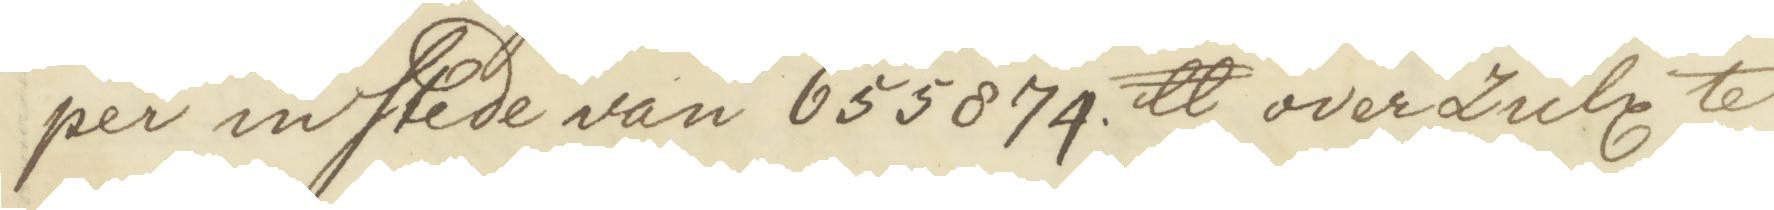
per in stede van 655874. lb over Zulx te
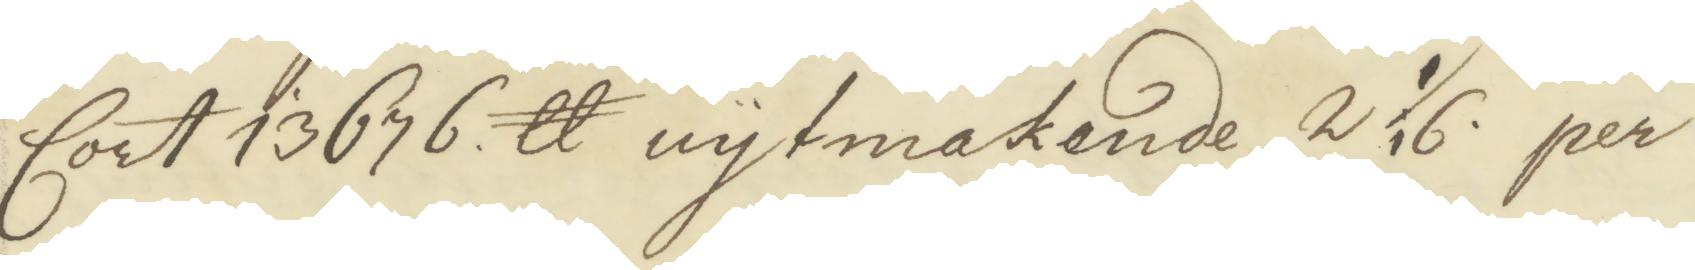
Cort 13676. lb uijtmakende 2 1/16. per
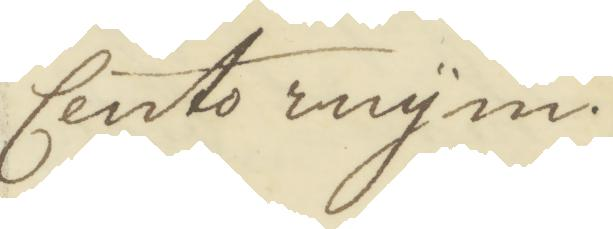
Cento ruijm.
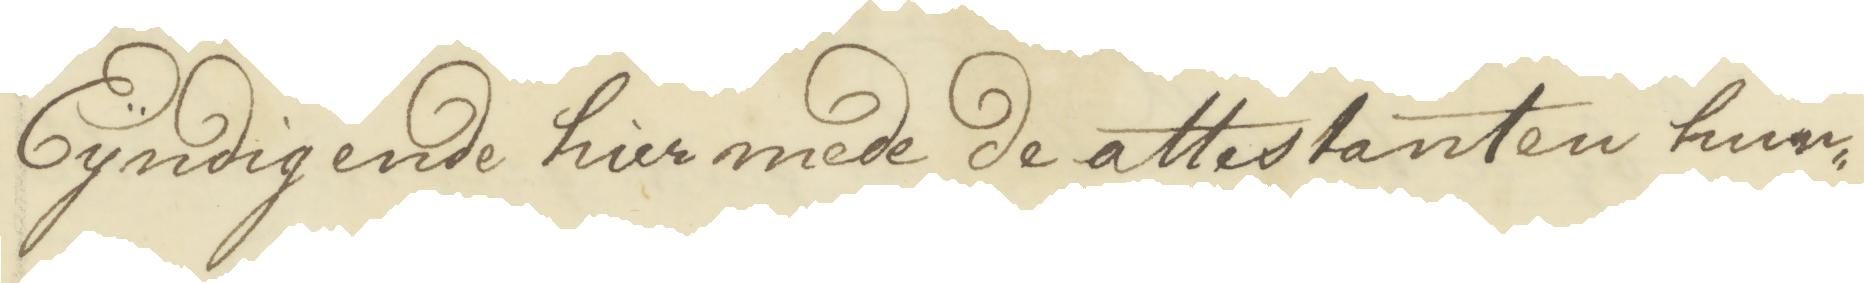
Eijndigende hier mede de attestanten hun„
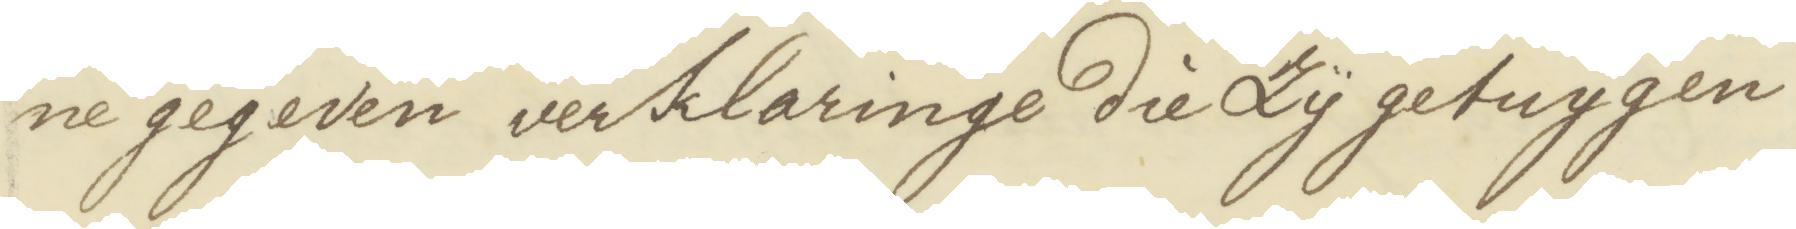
ne gegeven verklaringe die Zij getuijgen
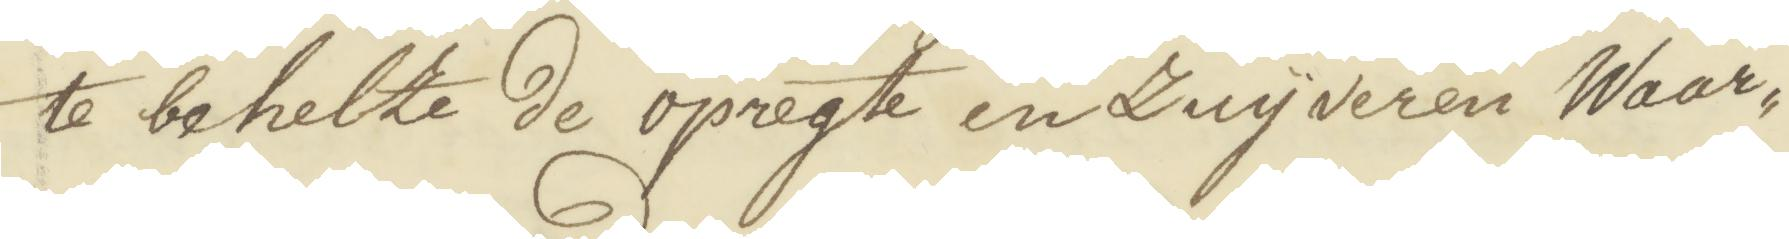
te behelze de opregte en Zuijveren Waar„
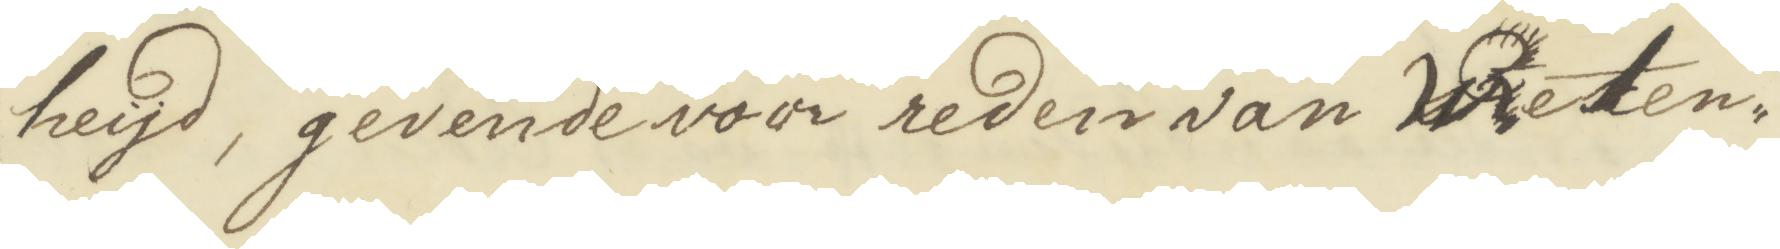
heijd, gevende voor reden van Weten„
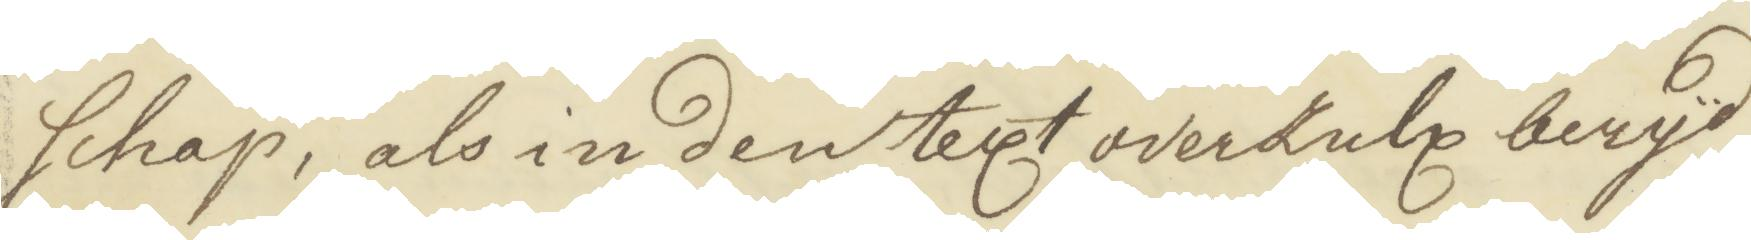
schap, als in den text overzulx berijd
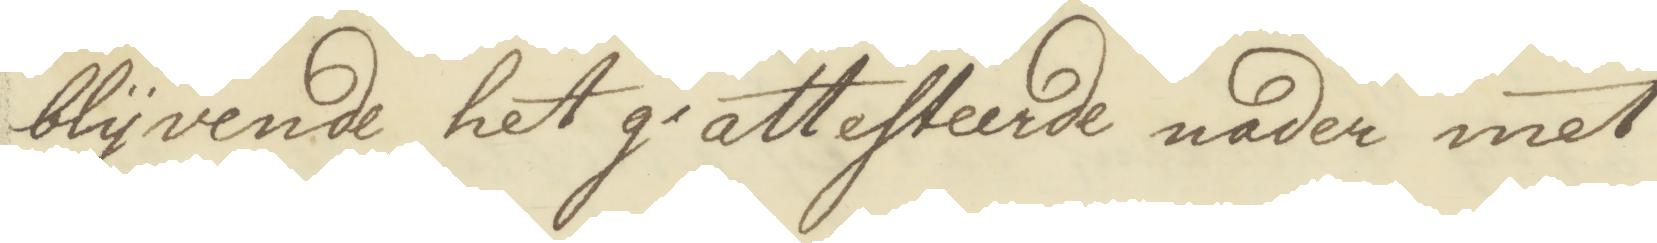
blijvende het g’attesteerde nader met
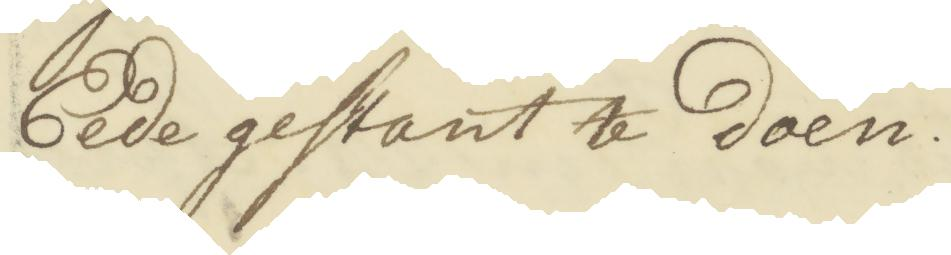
Eede gestant te doen.
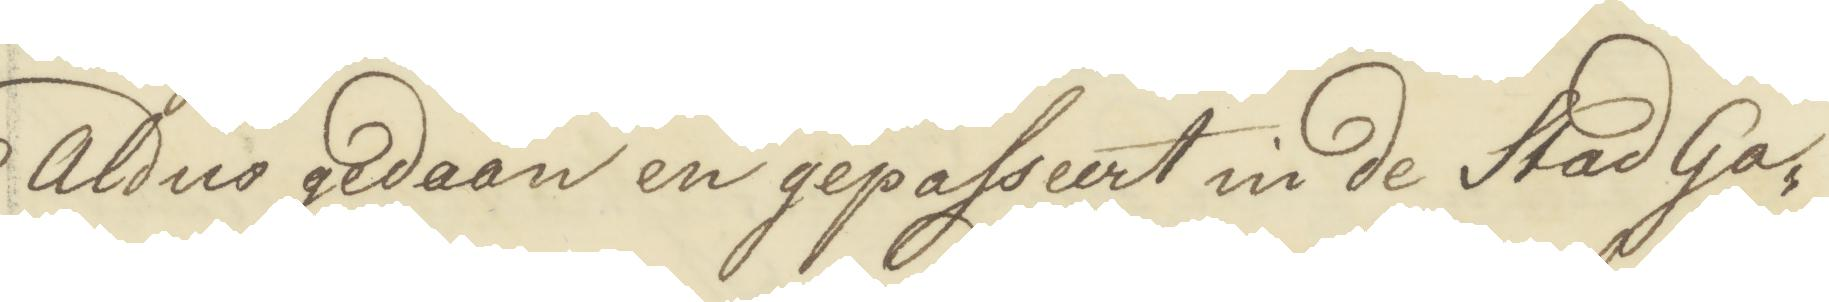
aldus gedaan en gepasseert in de Stad Ga„
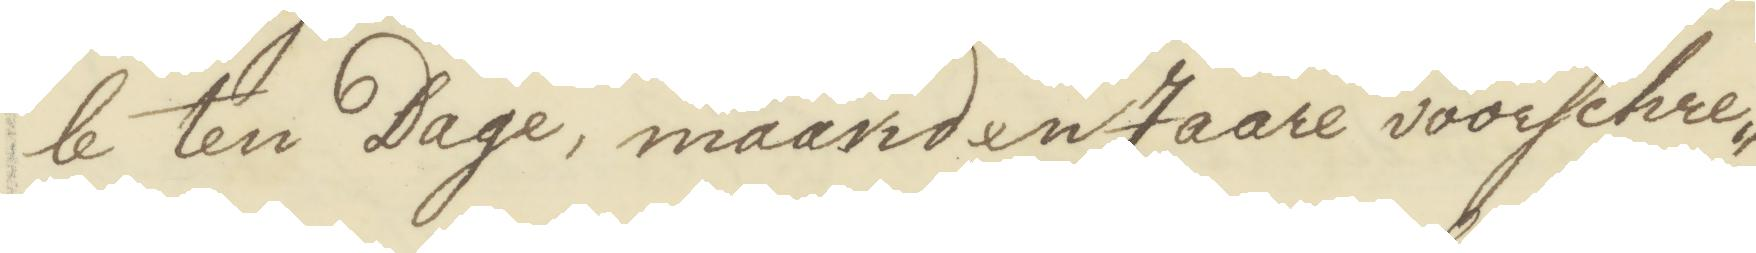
le ten Dage, maand en Jaare voorschre„
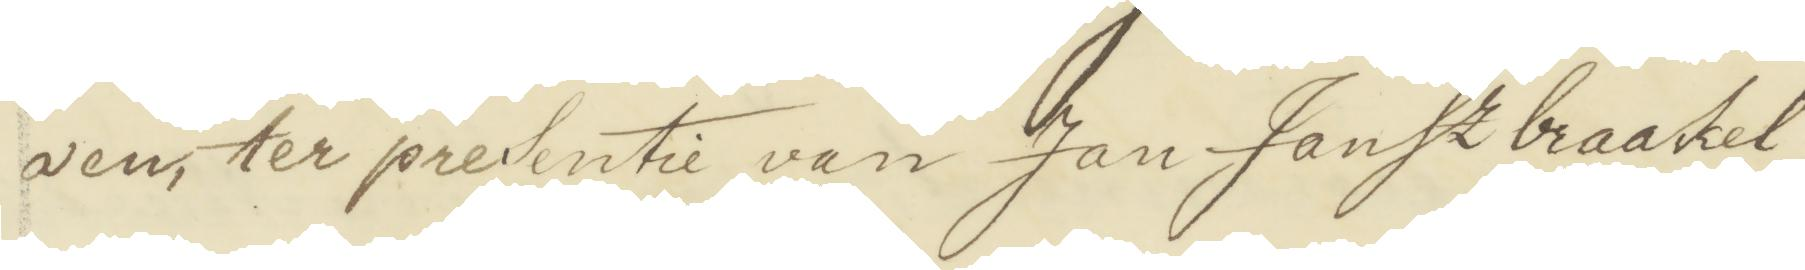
ven, ter presentie van Jan Jansz braakel
